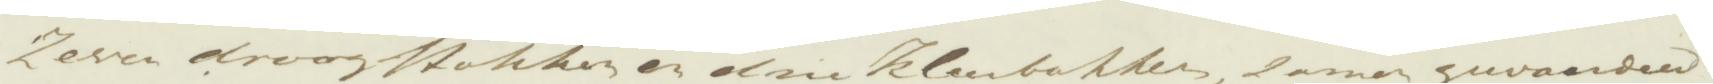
Zeven droog stokken en drie kleerbakken, zamen gewaardeerd
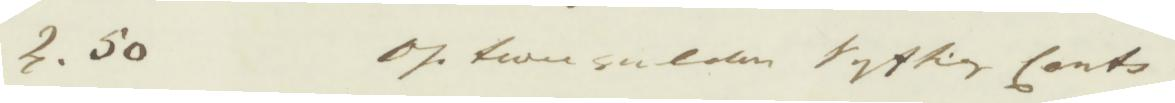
2. 50 op twee gulden Vyftig Cents
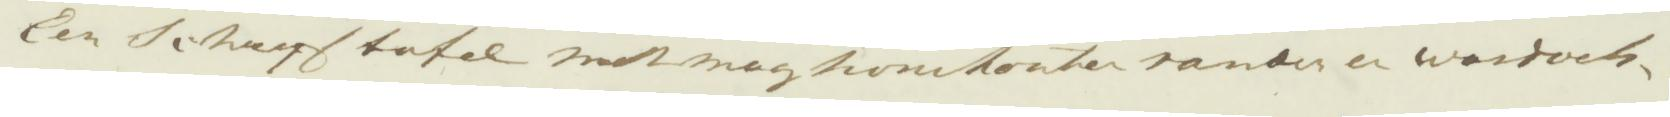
Een schuyf tafel met maghonihouten randen en wasdoek,
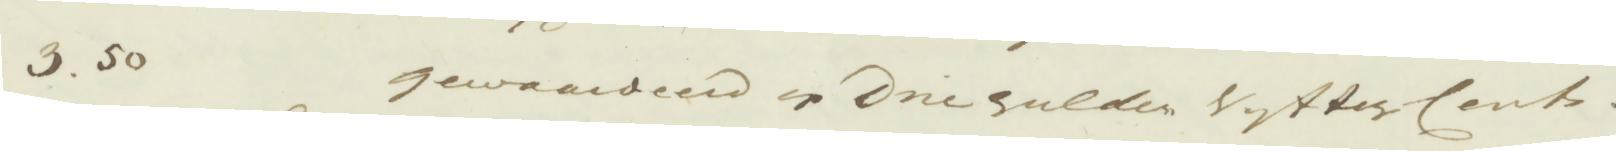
3. 50 gewaardeerd op drie gulden Vyftig Cents
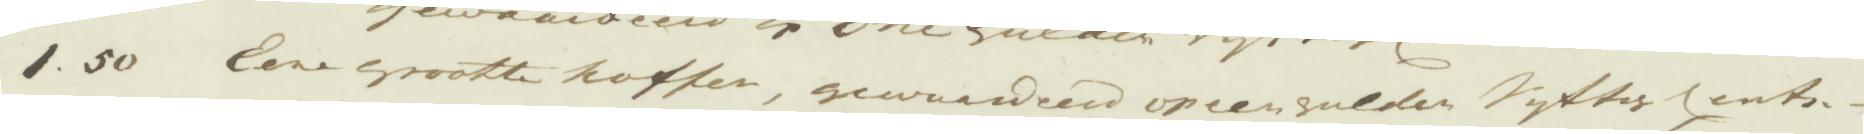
1. 50 Eene grootte koffer, gewaardeerd op een gulden Vyftig Cents.
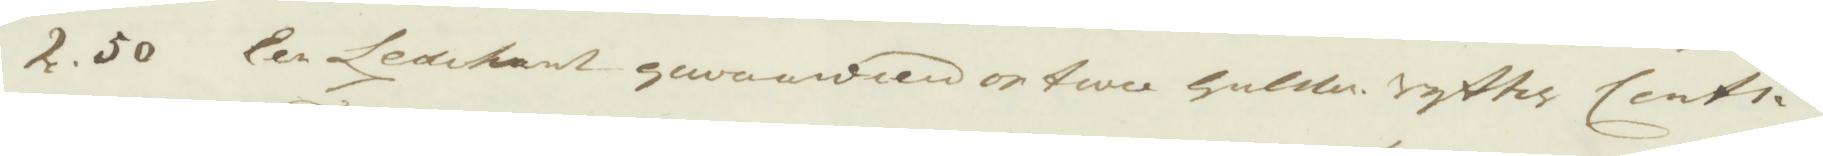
2.50 Een Ledikant gewaardeerd op twee Gulden vyftig Cents.
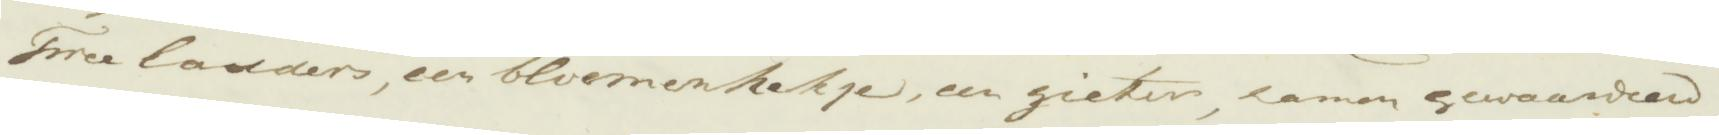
Twee ladders, een bloemenhekje, een gieter zamen gewaardeerd
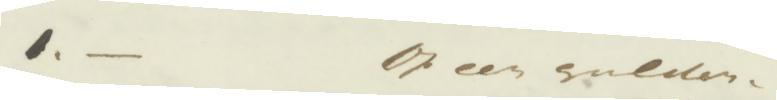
1. — Op een gulden.
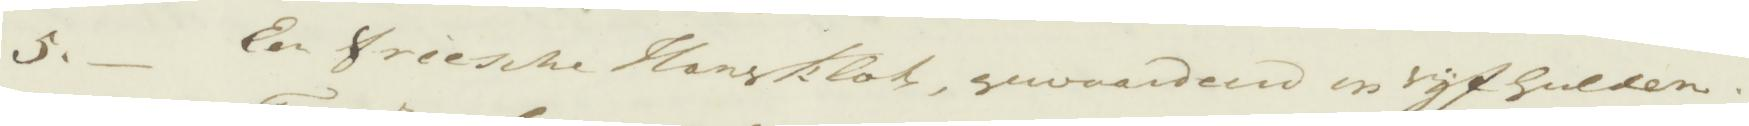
5. — Een friesche Hangklok, gewaardeerd op vijf Gulden
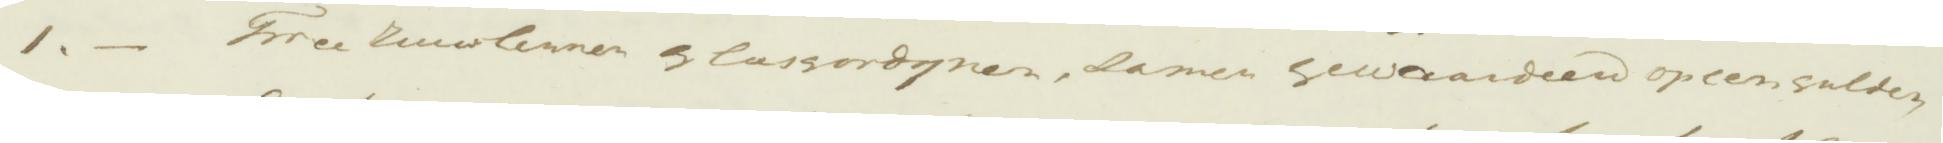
1. — Twee ruwlinnen glasgordijnen, zamen gewaardeerd op een gulden
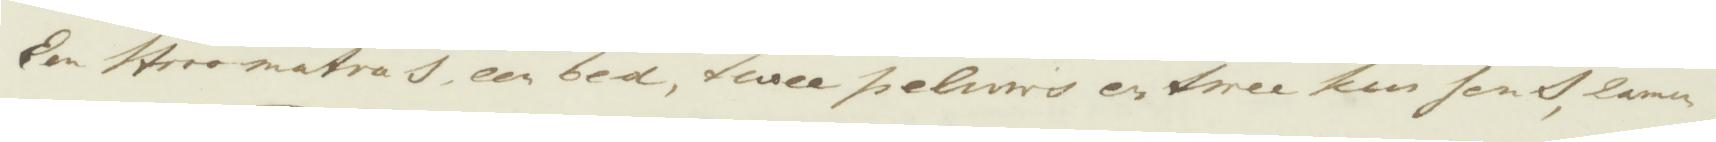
Een stroomatras, een bed, twee peluws en twee kussens, zamen
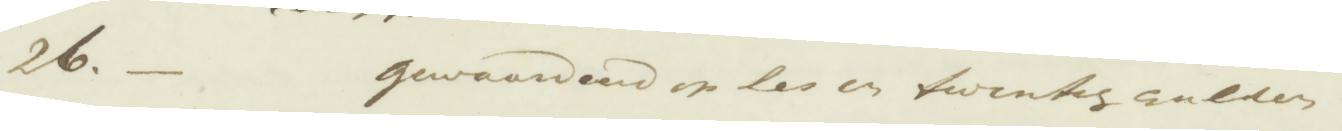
26. — gewaardeerd op zes en twintig gulden
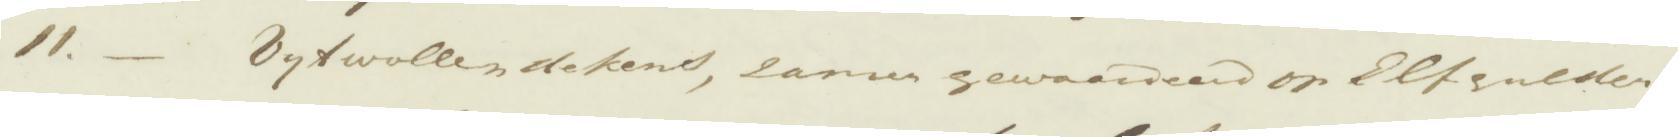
11. — Vyf wollen dekens, zamen gewaardeerd op Elf gulden.
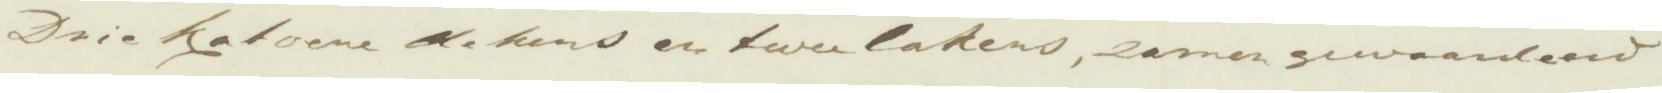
Drie Katoene dekens en twee lakens, zamen gewaardeerd
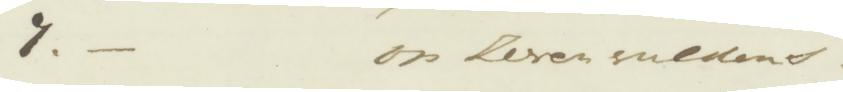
7. — op Zeven guldens
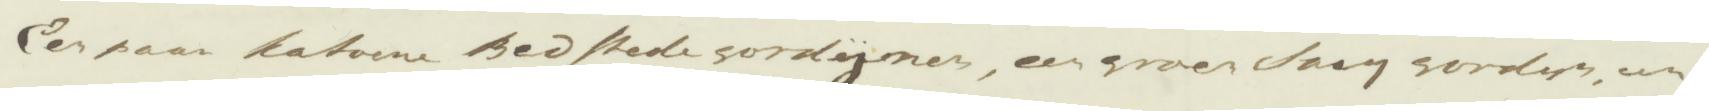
Een paar katoene Bedstede gordijnen, een groen Saay gordyn, een
